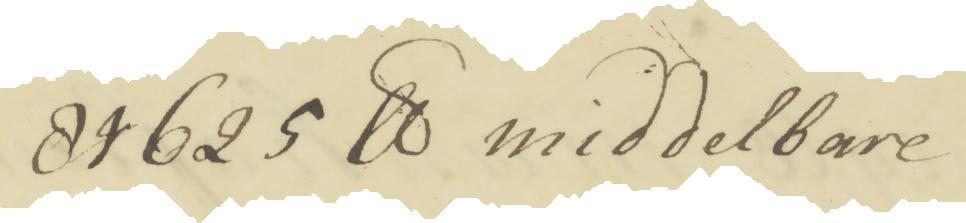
81625 lb middelbare
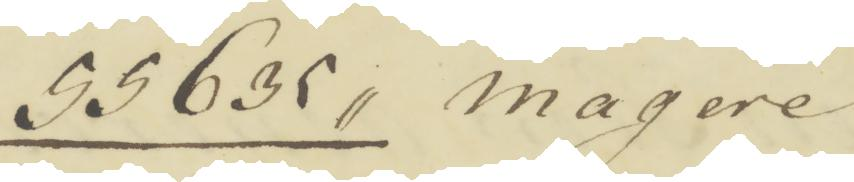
55635„ magere
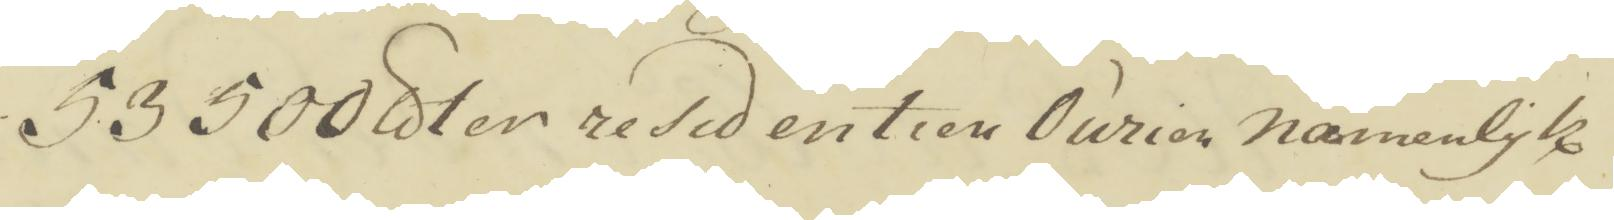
53500 lb ter residentien Ourier namenlijk
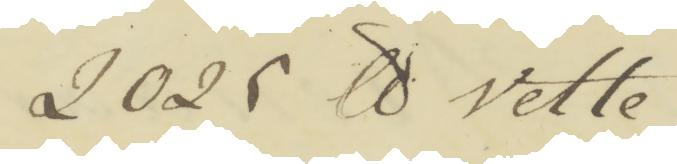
2025 lb vette
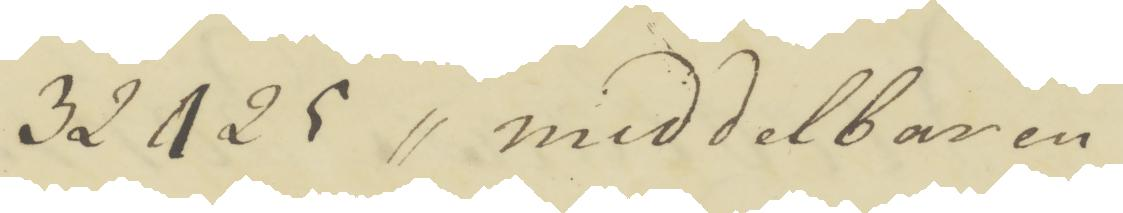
32425 „ middelbaren
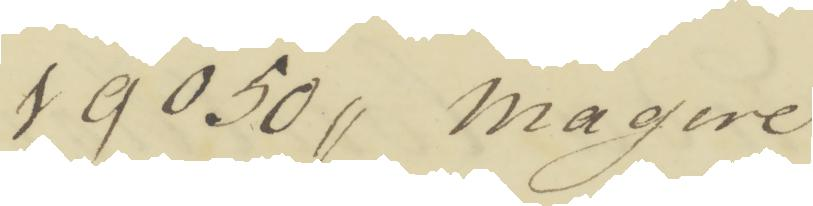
19050 „ magere
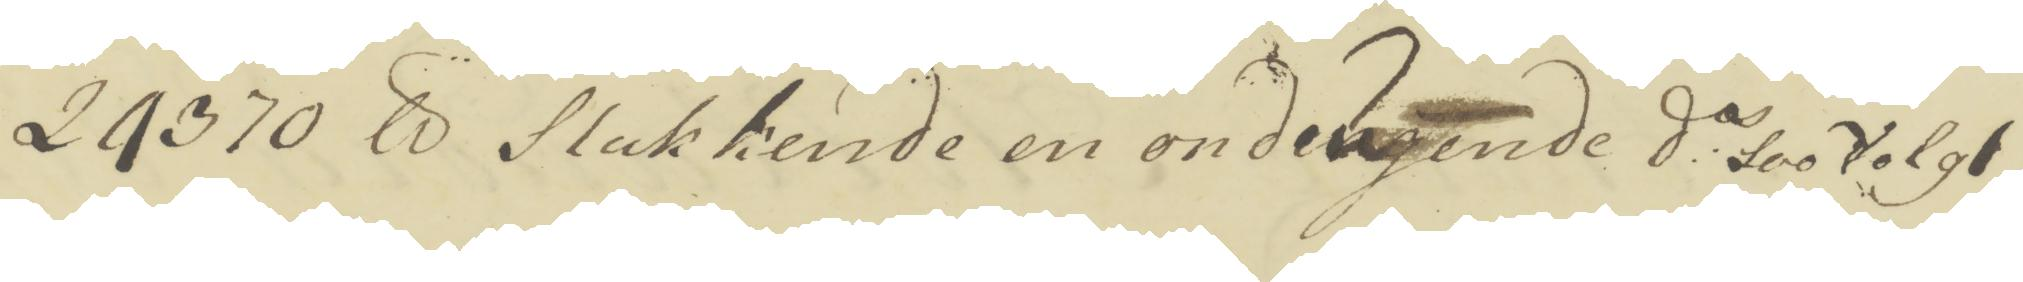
24370 ld stukkende en ondeugende d:os soo Volgt
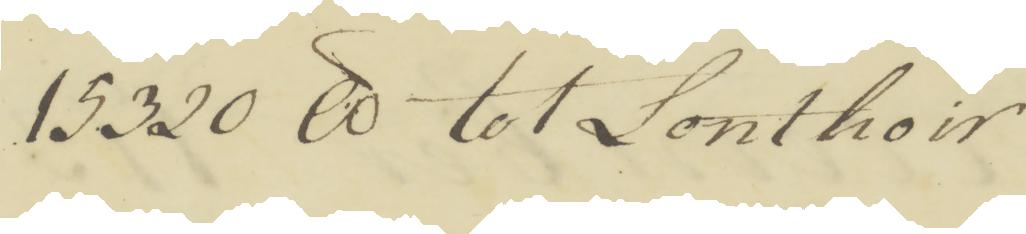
15320 lb tot Lonthoir
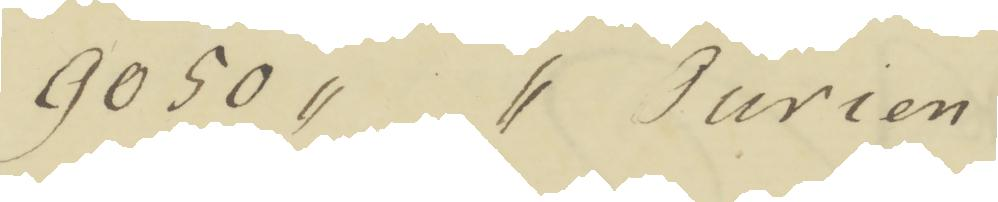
9050 „ „ Purien
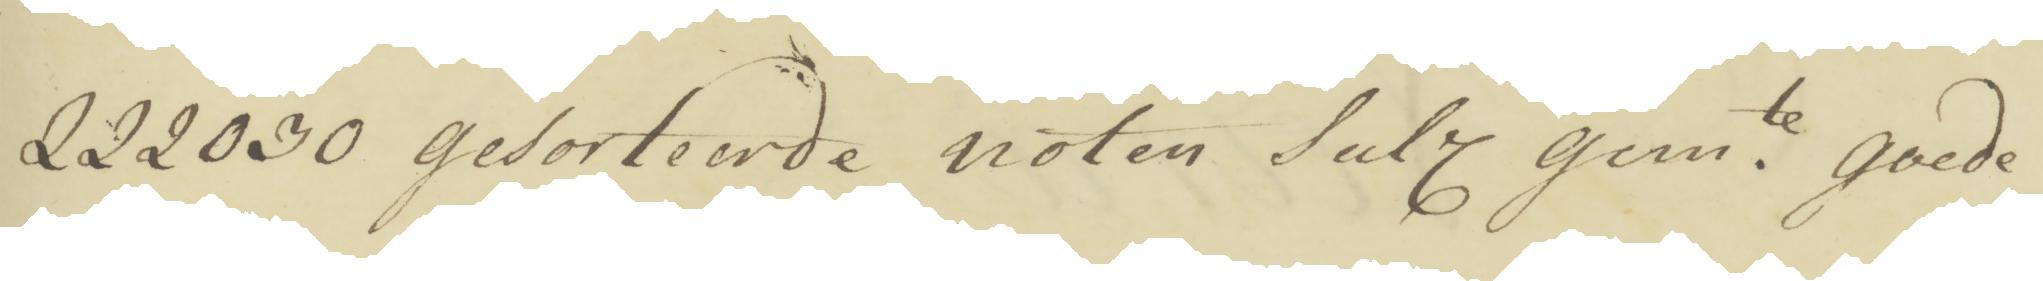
222030 gesorteerde noten sulx gem.te goede
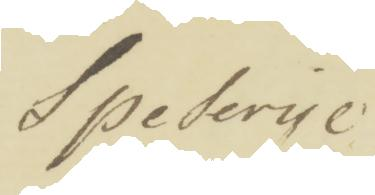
speserije
